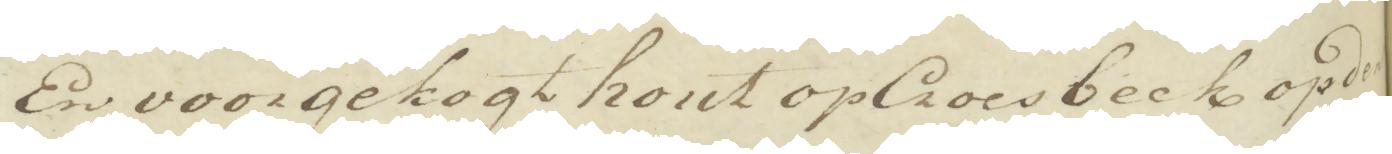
En voorgekogt hout op Croesbeek op den
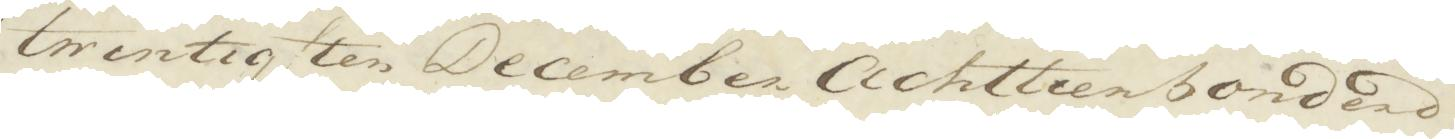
twintigsten December Achttienhonderd
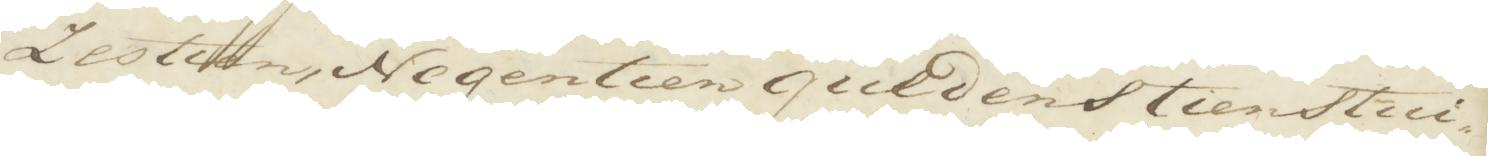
Zestien, Negentien guldens tienstui„
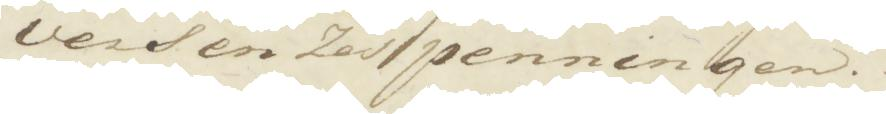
vers en zes penningen.
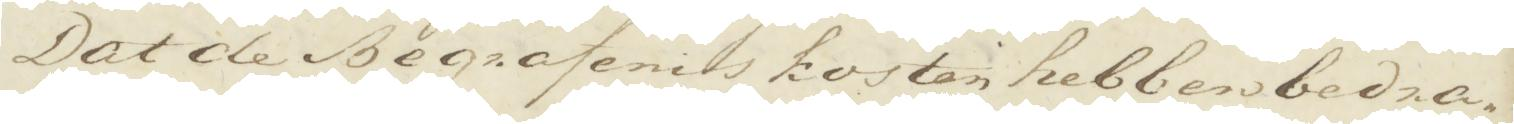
Dat de Begrafenis kosten hebben bedra„
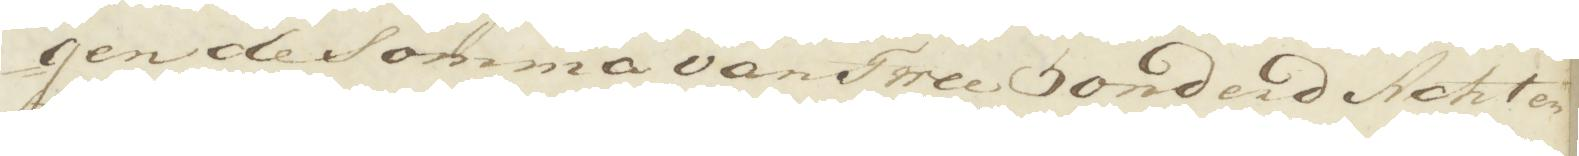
„gen de somma van Twee Honderd Achten
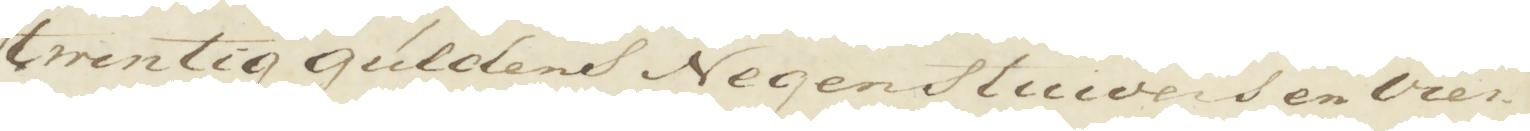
twintig guldens Negen stuivers en vier
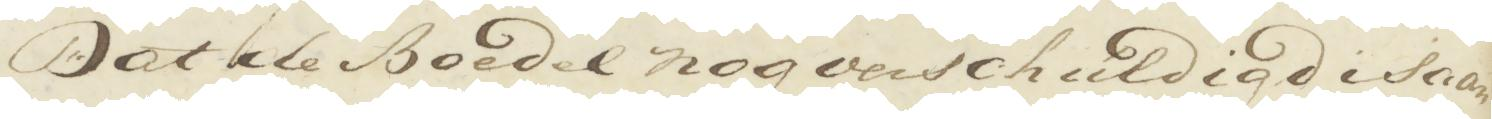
Dat de Boedel nog verschuldigd is aan
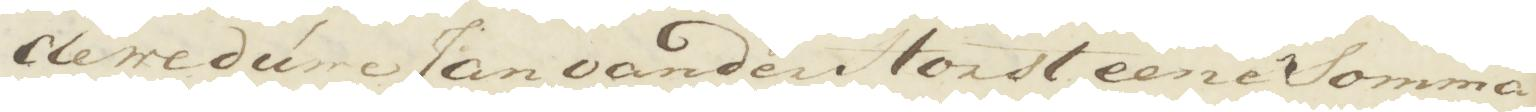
de weduwe Jan van den Horst, eene somma
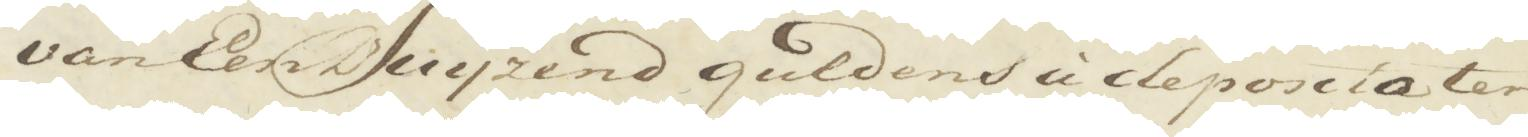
van Een Duyzend guldens à deposito ter
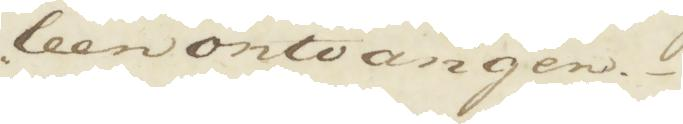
leen ontvangen.-
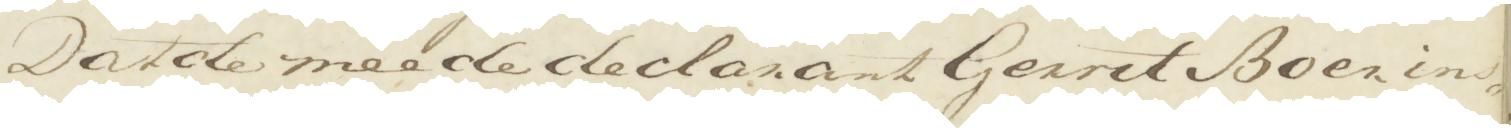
Dat de meede declarant Gerrit Boer ins„
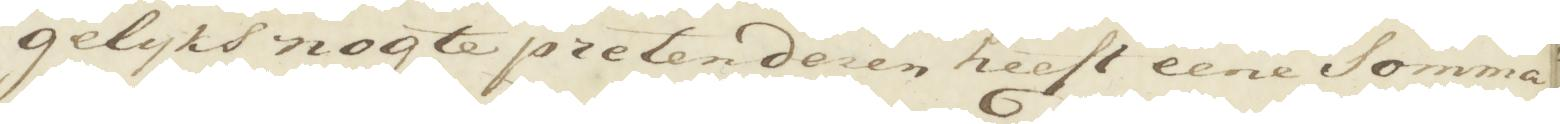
gelyks nog te pretenderen heeft eene somma
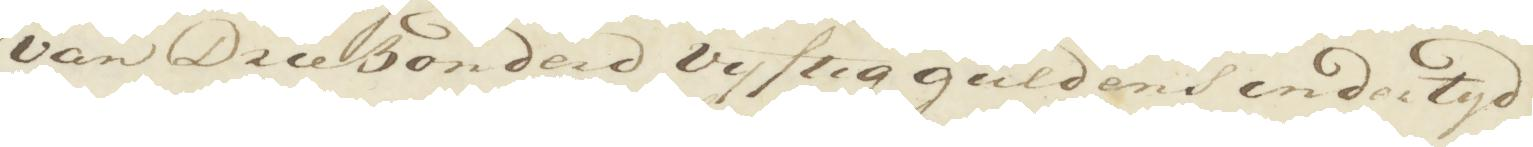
van Drie Honderd Vyftig guldens in der tijd
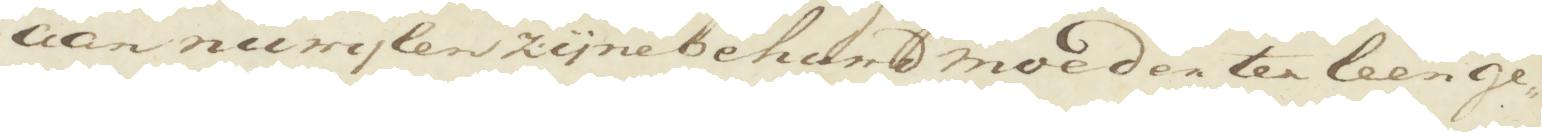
aan nu wylen zijne behuwd moeder ter leen ge„
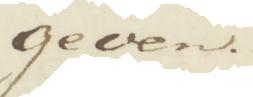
geven.
